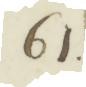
61.
